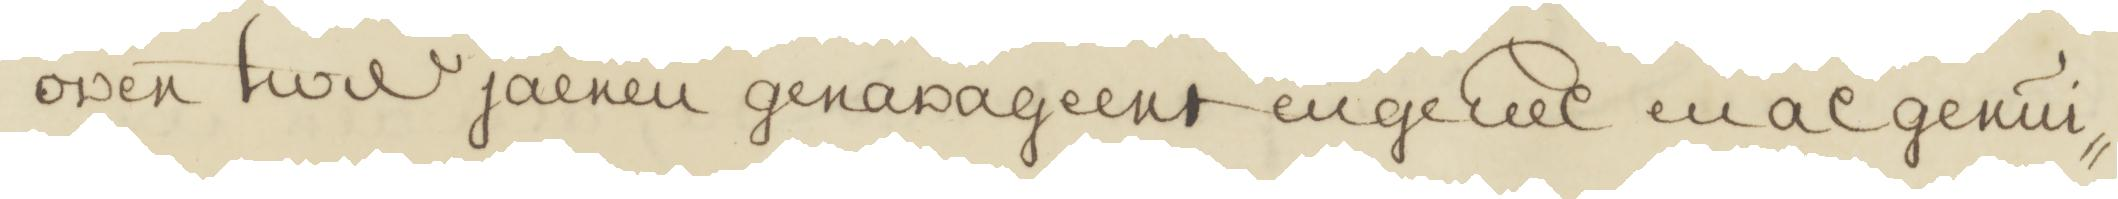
over twee jaeren geravageert en geheel en al gerui„
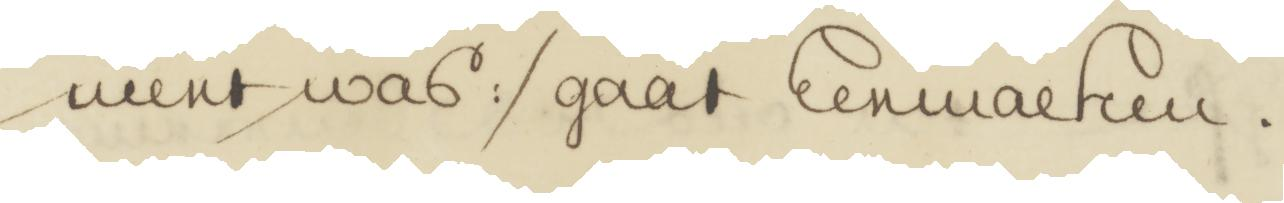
neert was :/ gaat eermaeken.
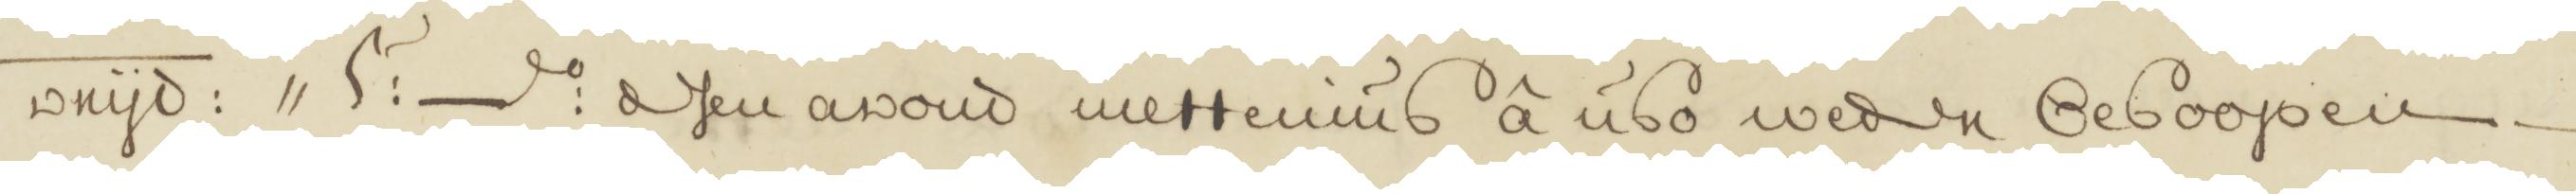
vrijd: „ 5:' d:o desen avond mettenius â uso weder besoopen
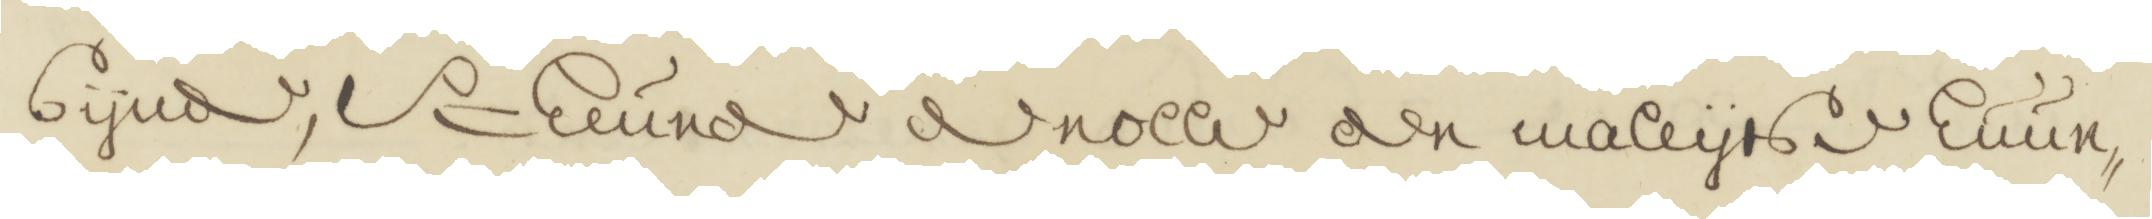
sijnde, Scheurde de rolle der maleijtse huur„
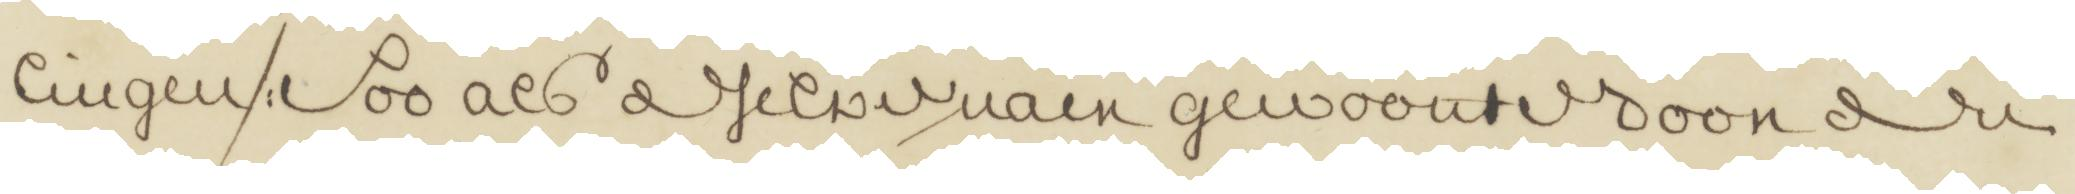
lingen /: Soo als deselve naer gewoonte door den
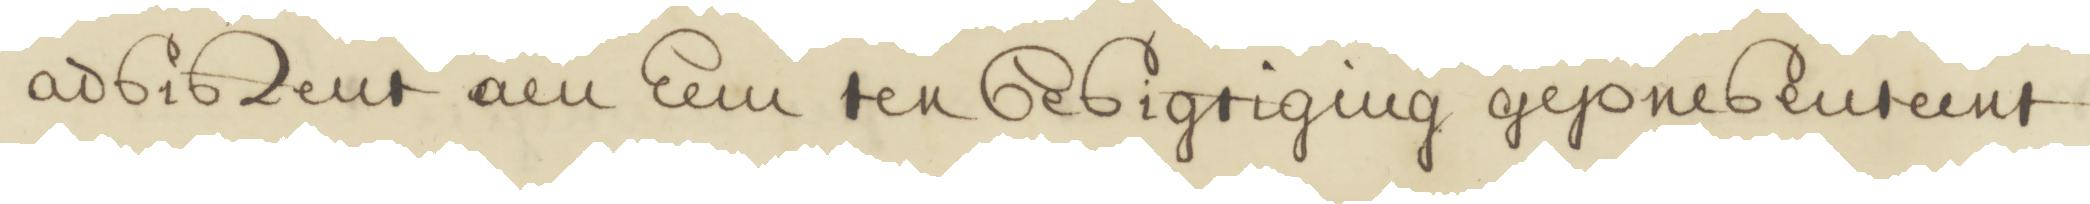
adsistent aen hem ter besigtiging gepresenteert
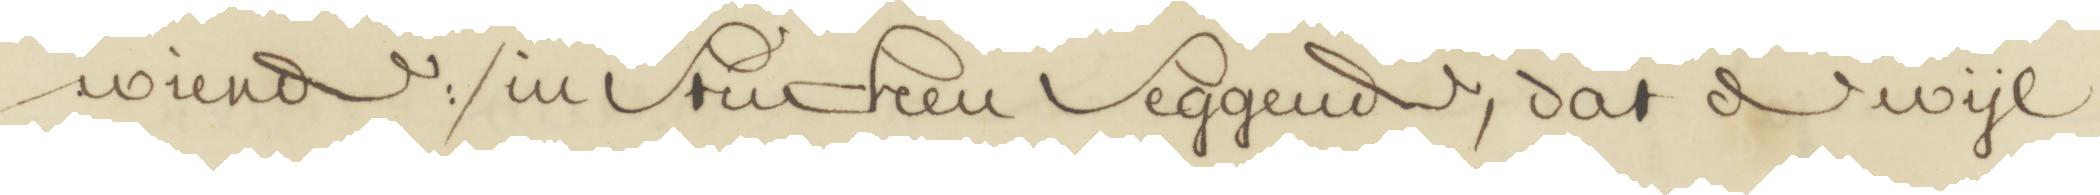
wierde :/ in Stucken Seggende, dat dewijl
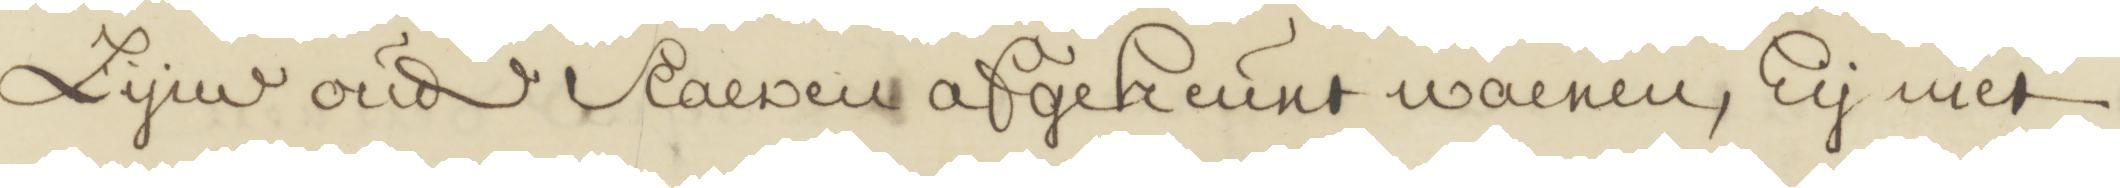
Zijne oude slaeven afgekeurt waeren, hij niet
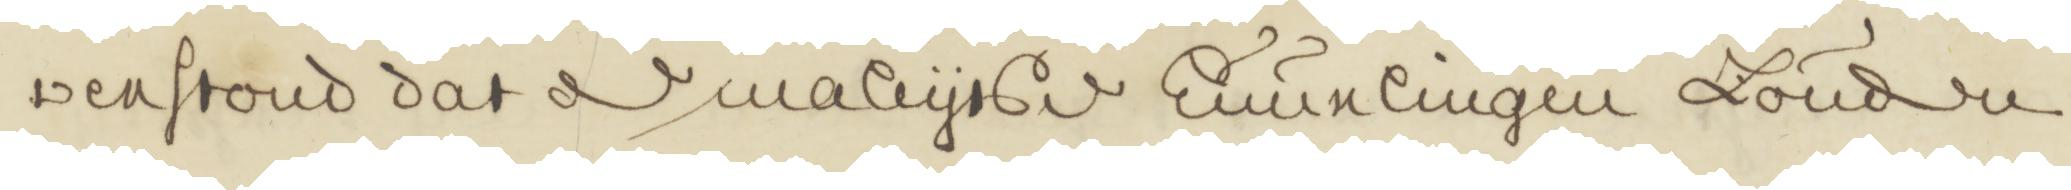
verstond dat de maleijtse huurlingen Zouden
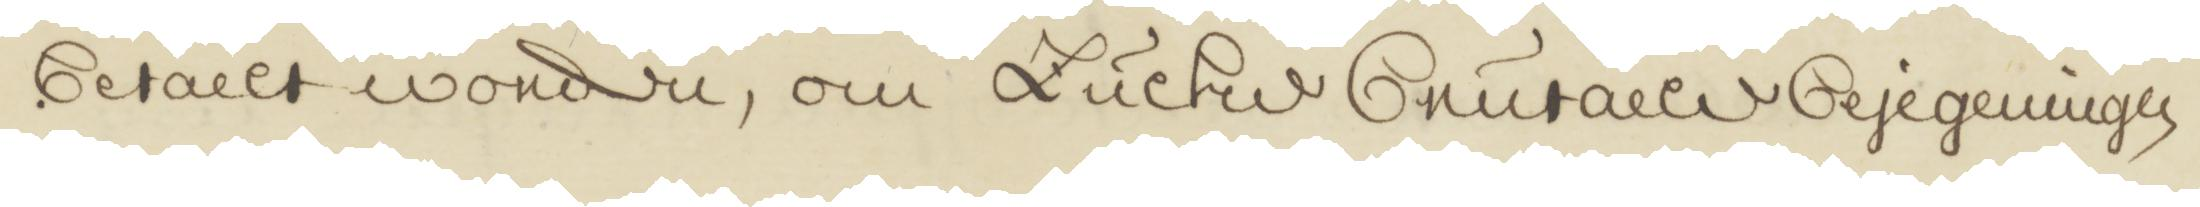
betaelt worden, om Zulke Brutaele bejegeningen
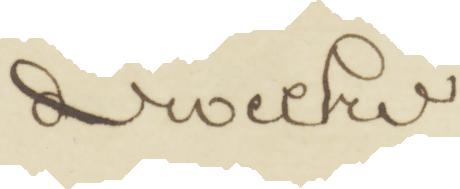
dewelke
